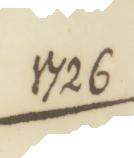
1726
